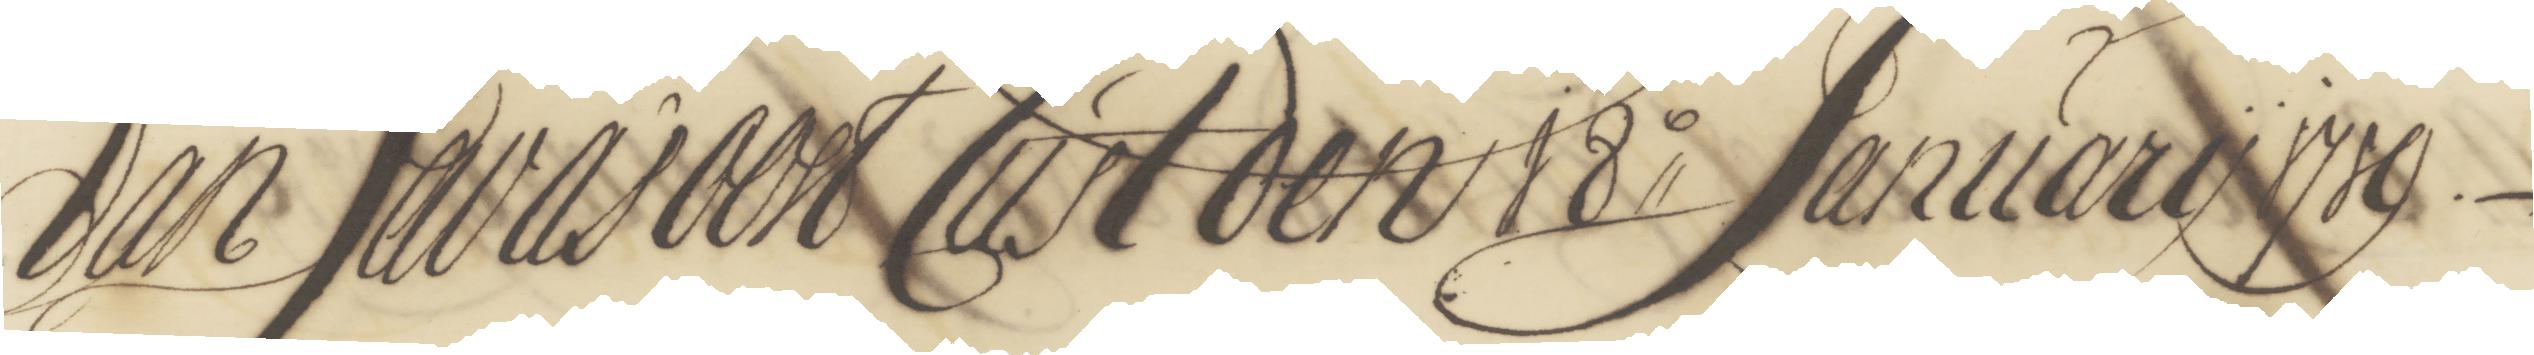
Van Java's oost Cust den 18„e Januarij 1719. —
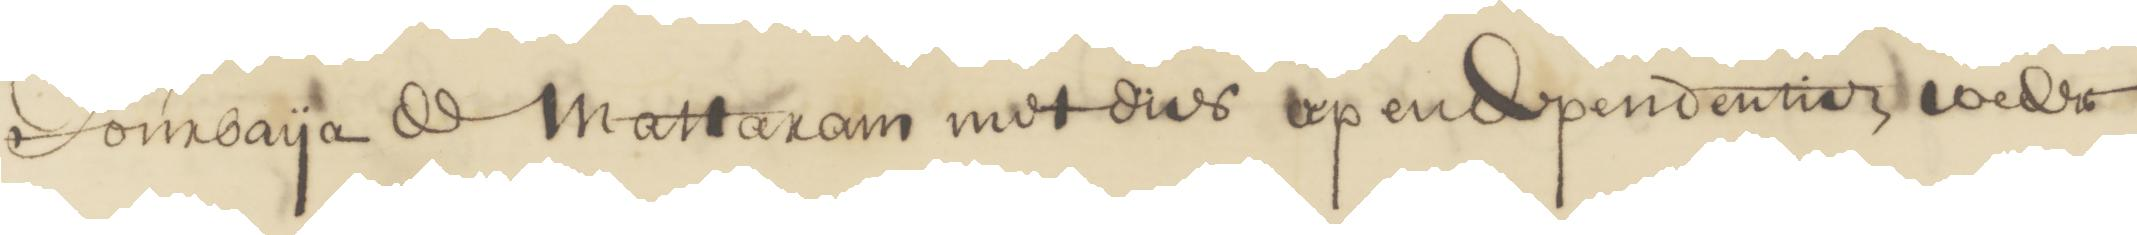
Sourbaija de Mattaram met dies op en dependentien weder
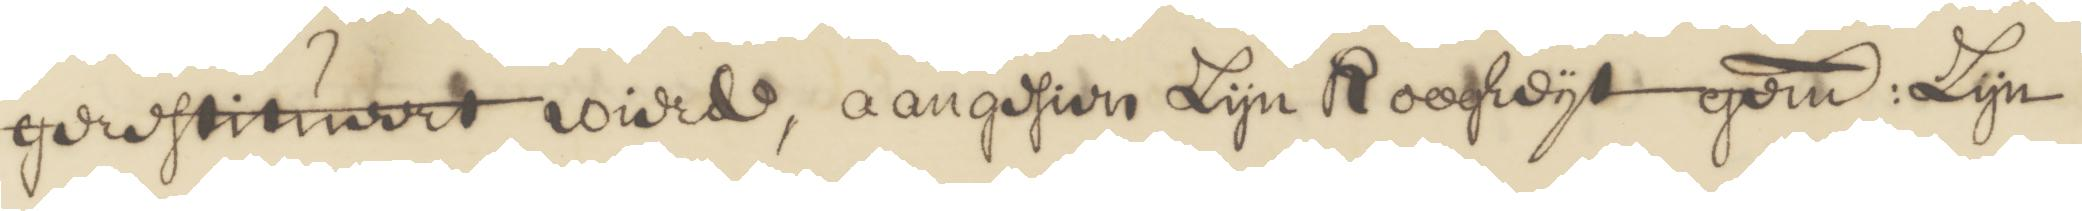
gerestitueert wierde, aangesien Zijn Hoogheijt gem: Zijn
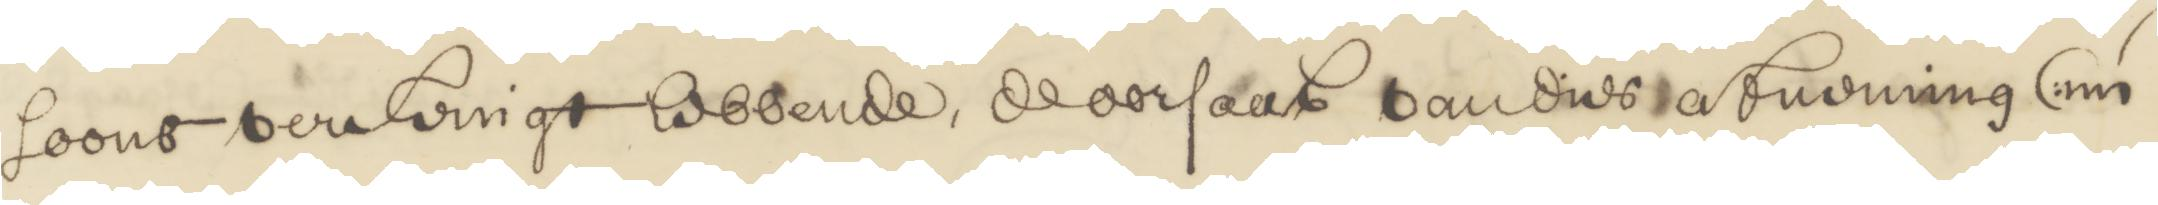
soons vereenigt hebbende, de oorsaak van dies afneming (:nu
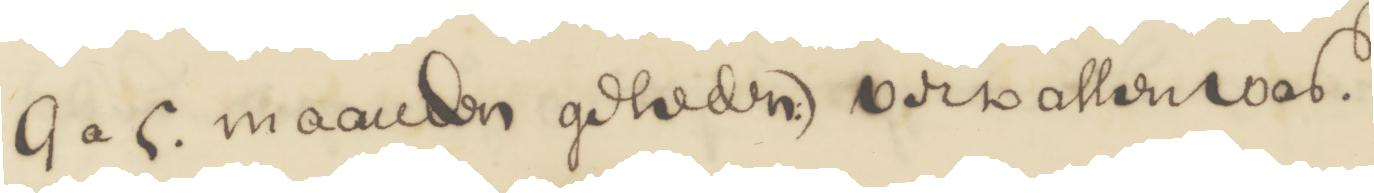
4 a 5. maanden geleden:) vervallen was.
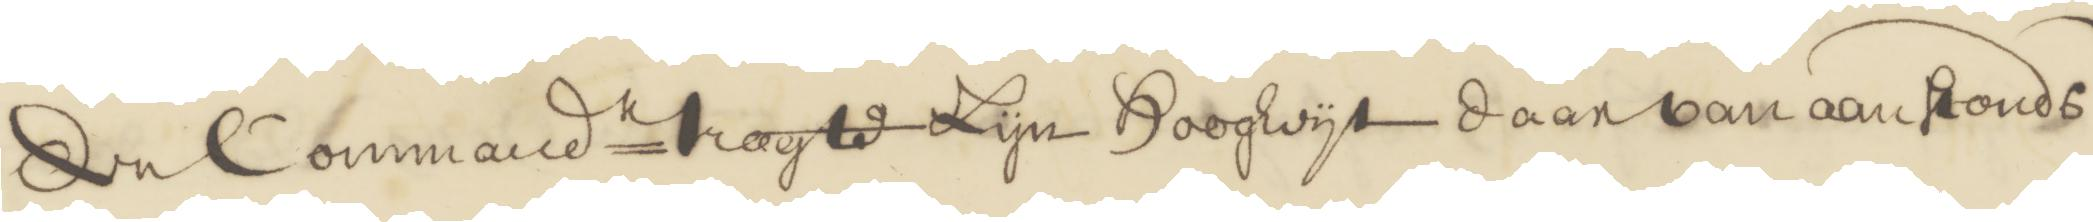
den Command=r tragte Zijn Hoogheijt daar van aanstonds
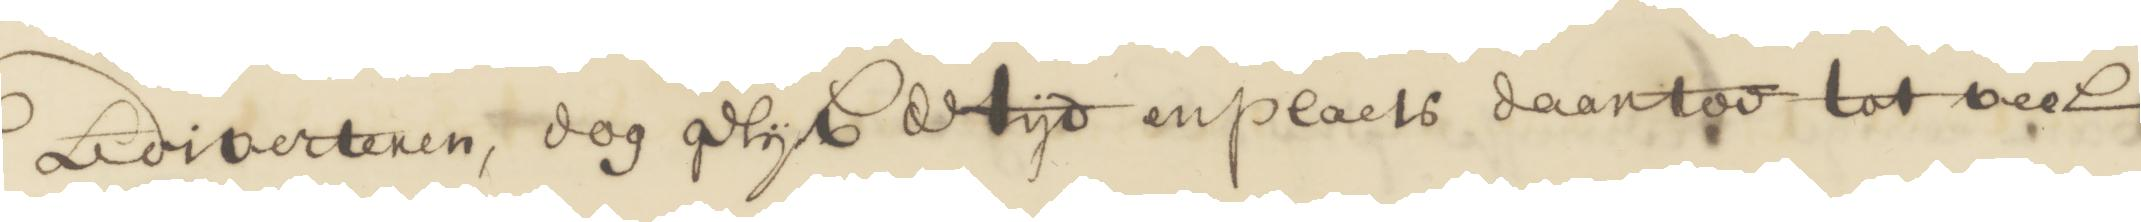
te diverteren, dog gelijk de tijd enplaets daartoe tot veel
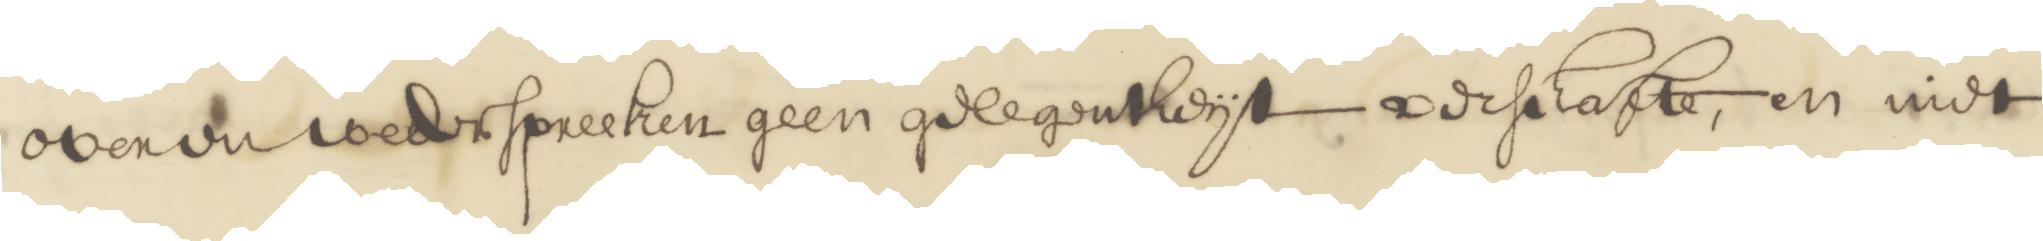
over en wederspreeken geen gelegentheijt verschafte, en niet
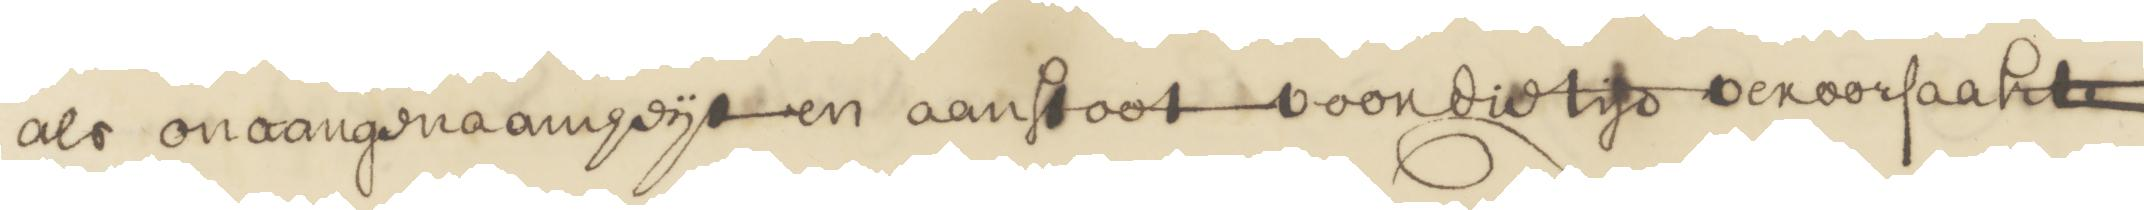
als onaangenaamheijt en aanstoot voor die tijd veroorsaakt
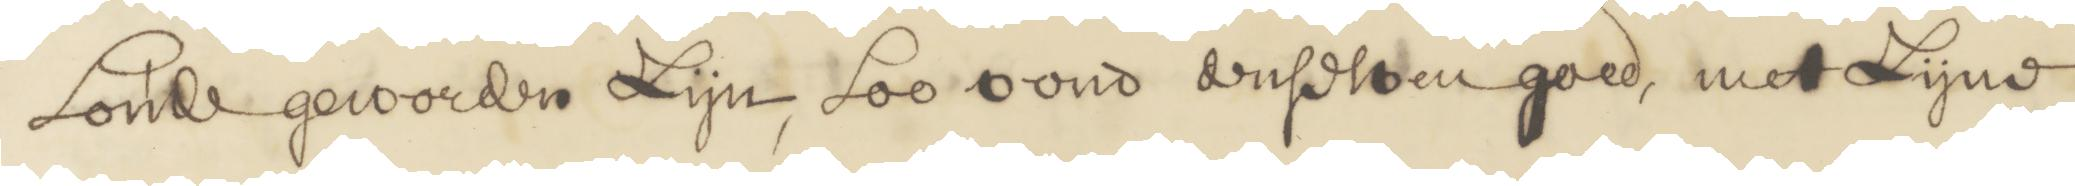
Soude geworden Zijn, soo vond denselven goed, met Zijne
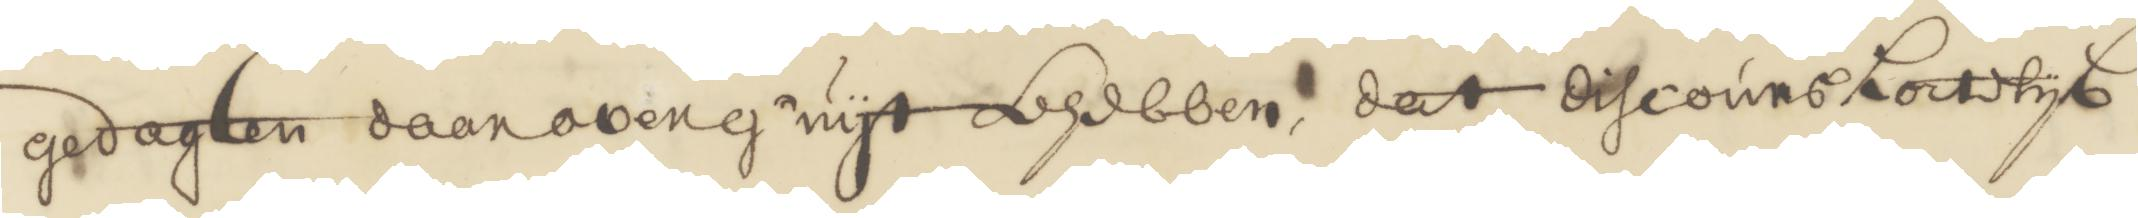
gedagten daar over g’uijt te hebben, dat discours kortelijk
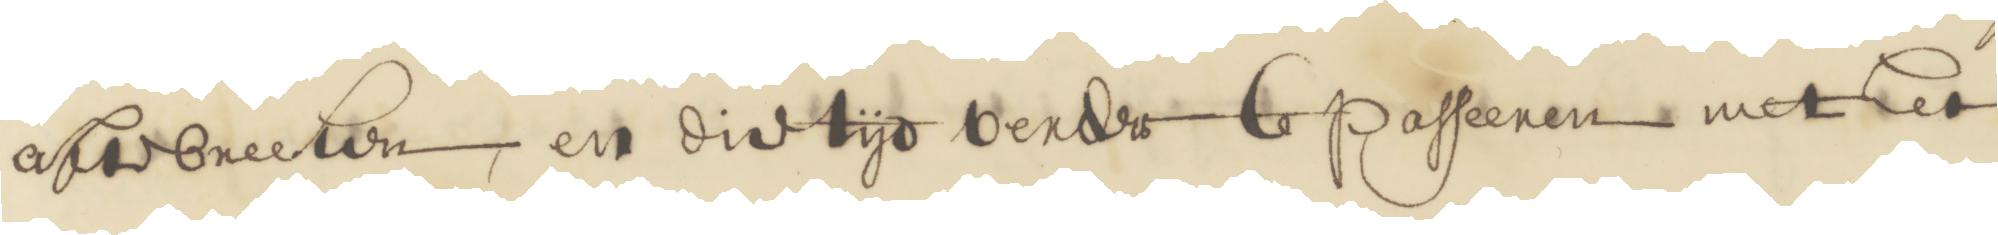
aftebreeken, en die tijd verder te passeeren met het
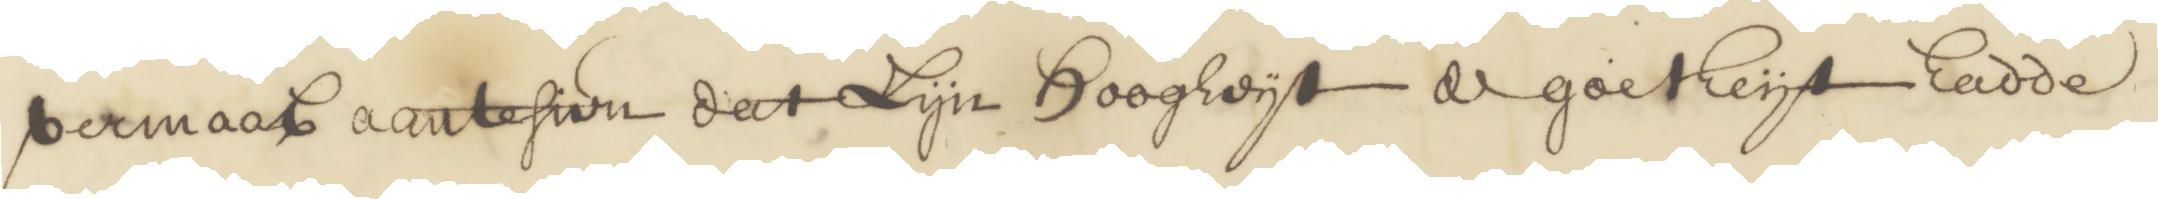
vermaak aantesien dat Zijn Hoogheijt de goetheijt hadde
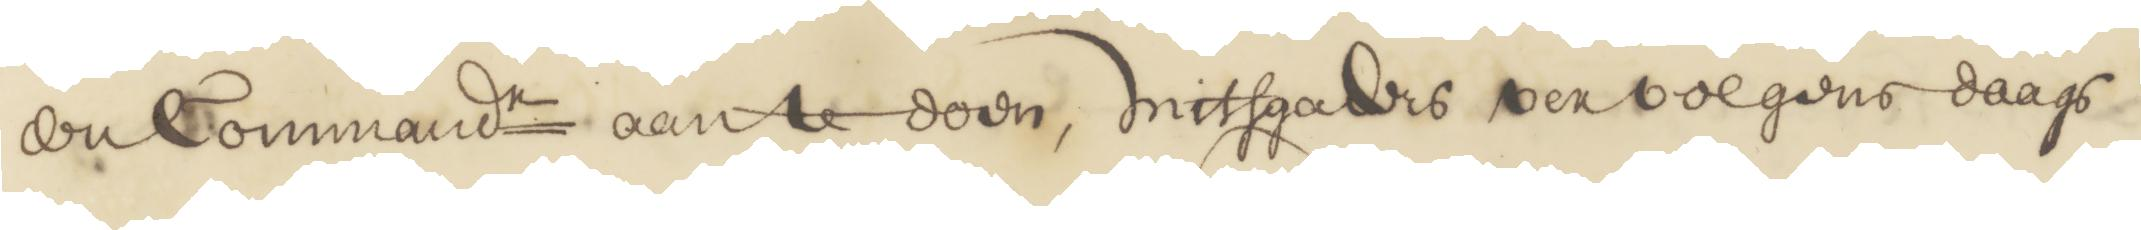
den Command=r aan te doen, mitsgaders vervolgens daags
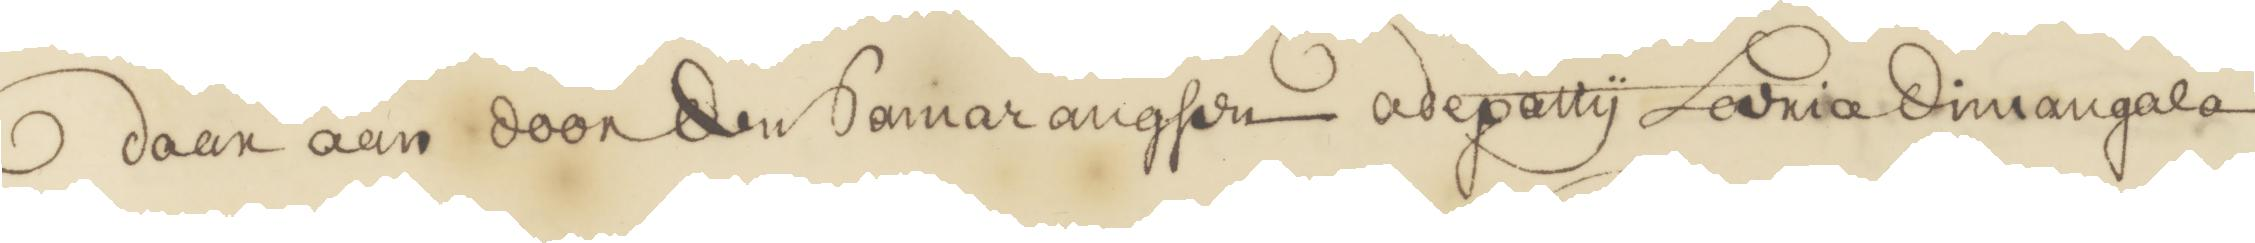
daar aan door den Samarangsen adepattij Soeria dimangala
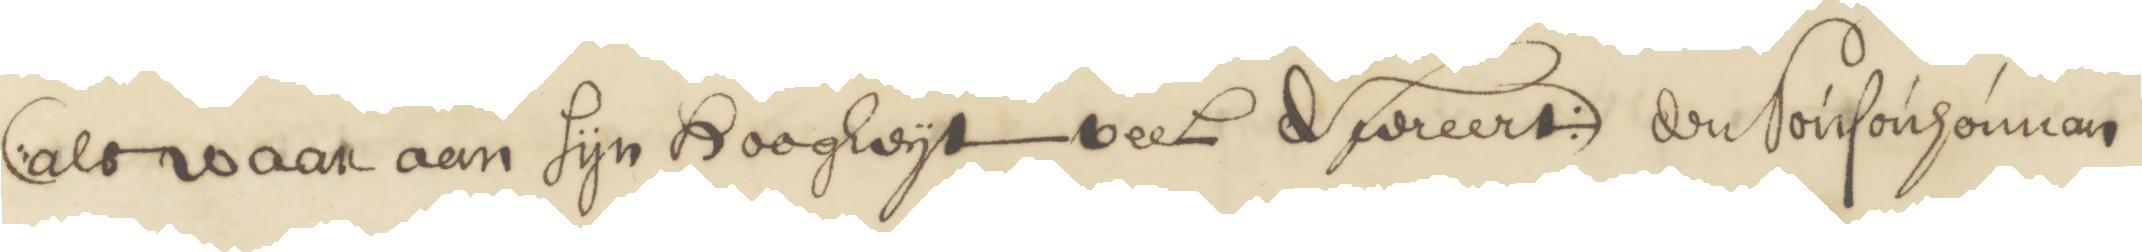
(:als waar aan Sijn Hoogheijt veel defereert:) den Sousouhounan
